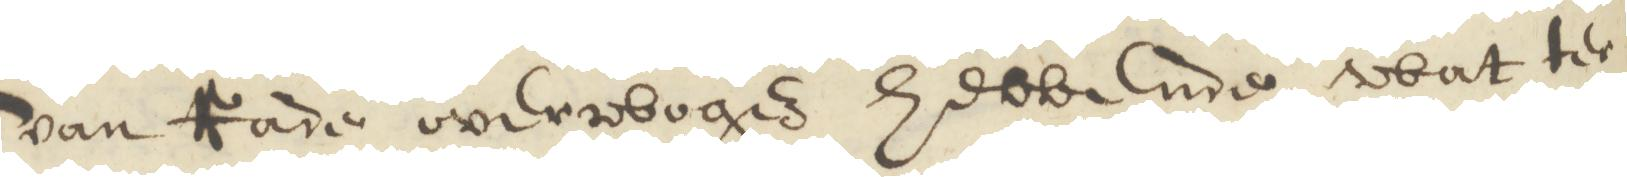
van Rade overwogen hebbende wat ter
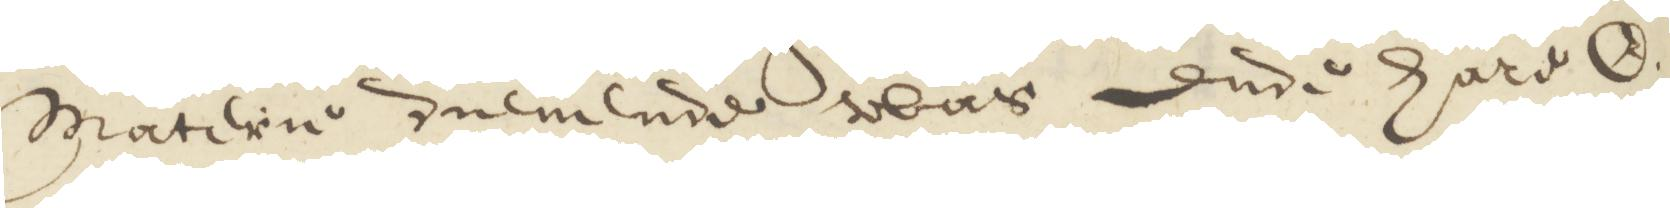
Materie dienende was Ende hare O.
